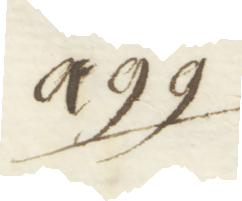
499
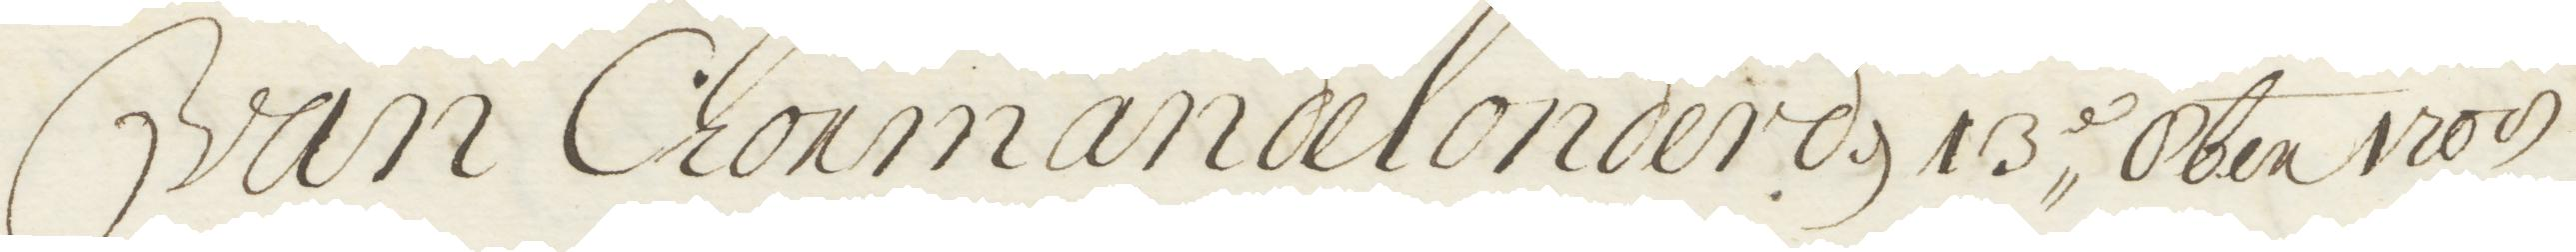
Van Chormandel onder den 13„e 8ber 1708
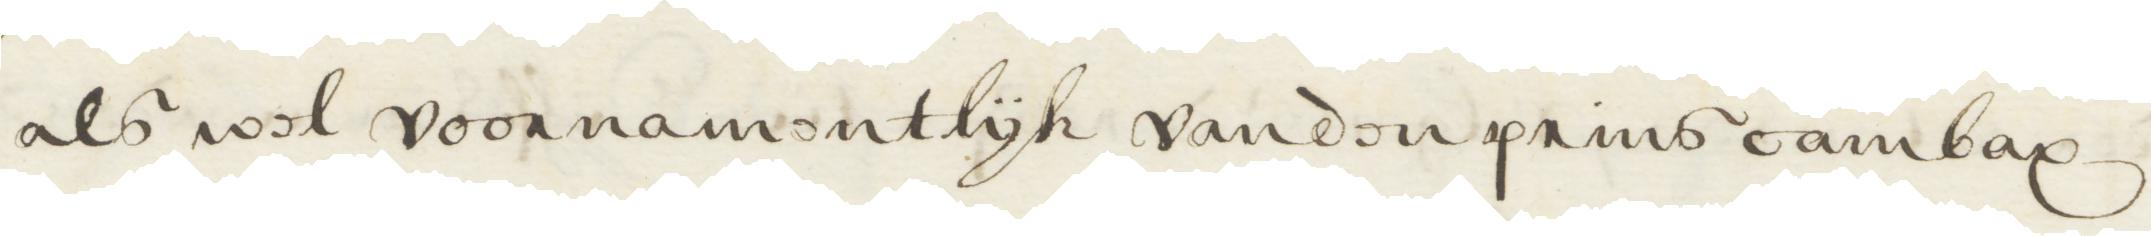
als wel voornamentlijk van den prins cambax
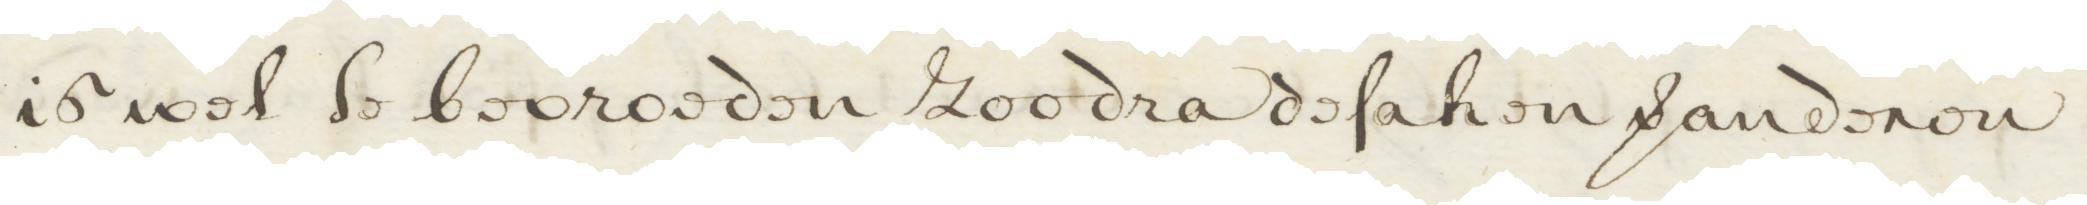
is wel te bevroeden, zoodra de saken veranderen
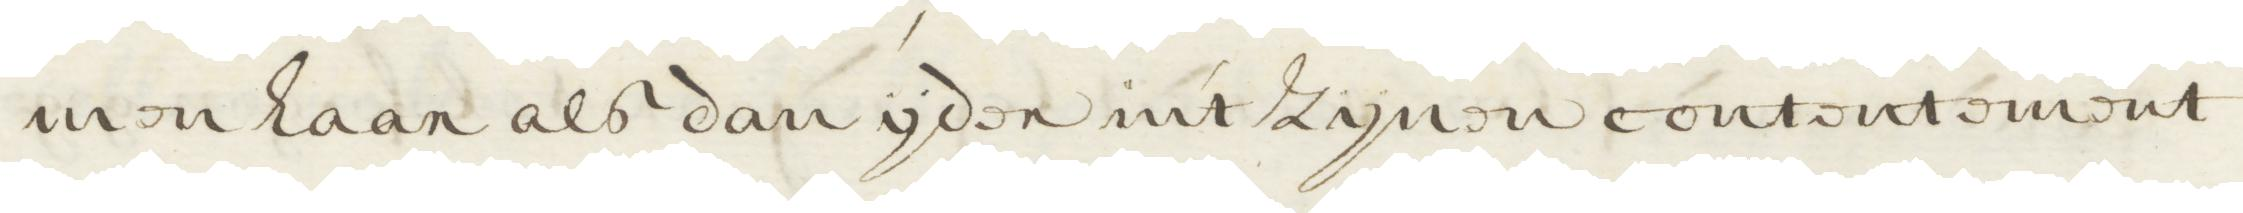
men haar als dan ijder in't zijnen contentement
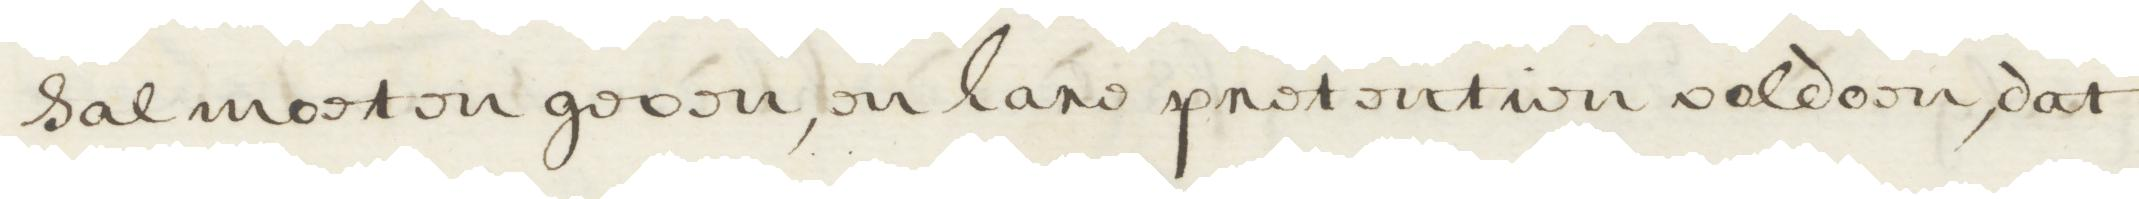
sal moeten geven, en hare pretentien voldoen, dat
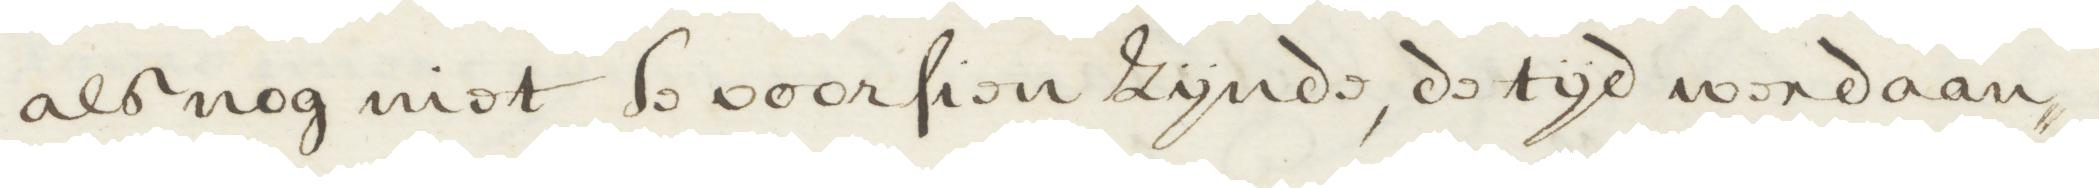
als nog niet te voorsien zijnde, de tijd werd aan„
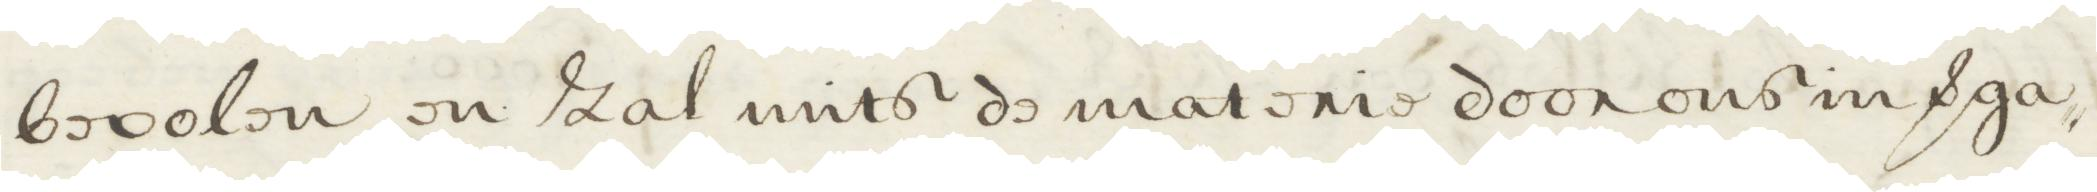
bevolen en zal mits de materie door ons in verga„
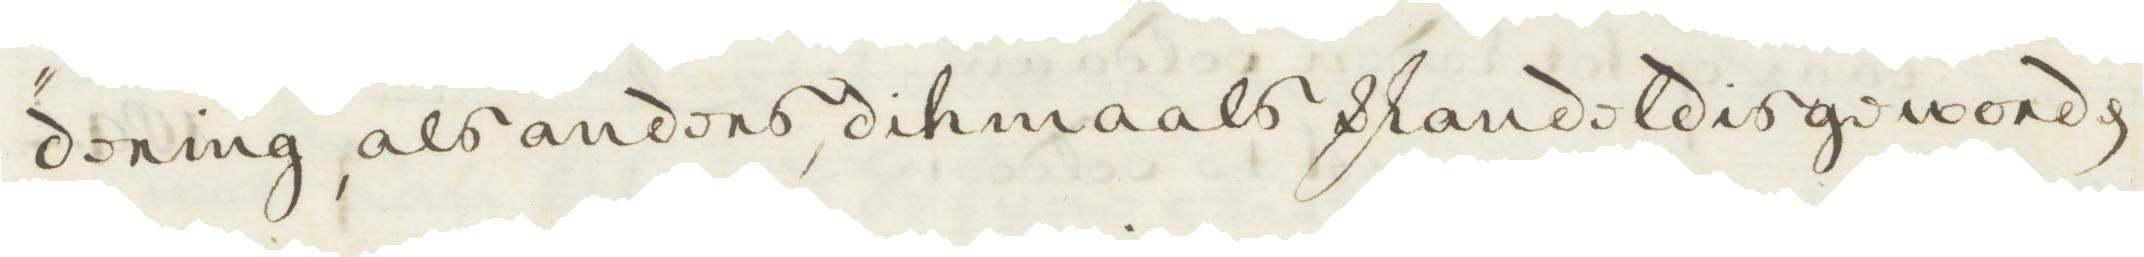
dering, als anders, dikmaals verhandeld is geworden
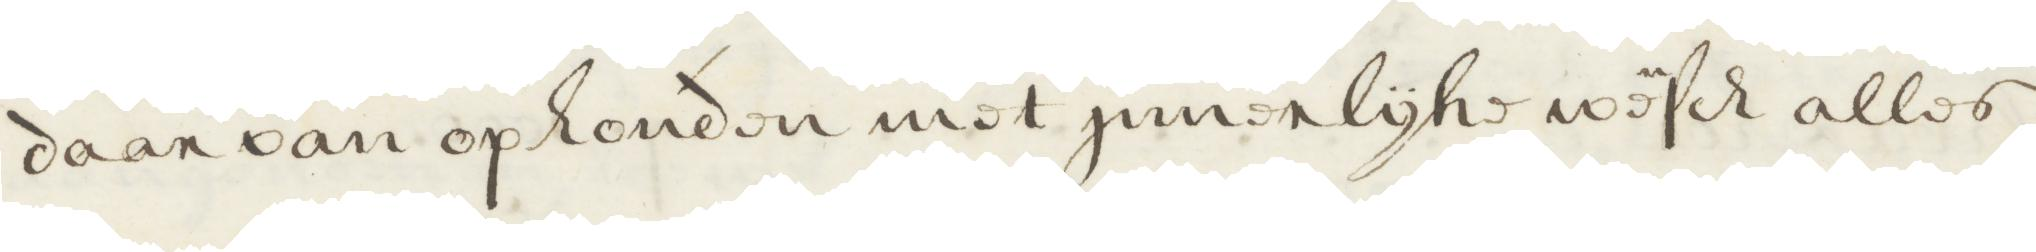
daar van op houden met jnnerlijke wensch alles
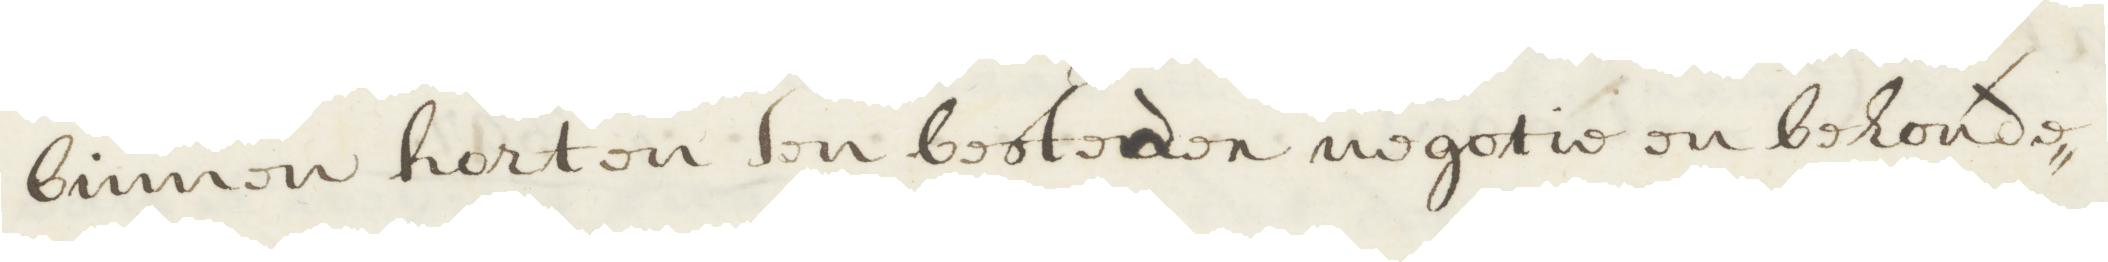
binnen kort en ten besteder negotie en behoude„
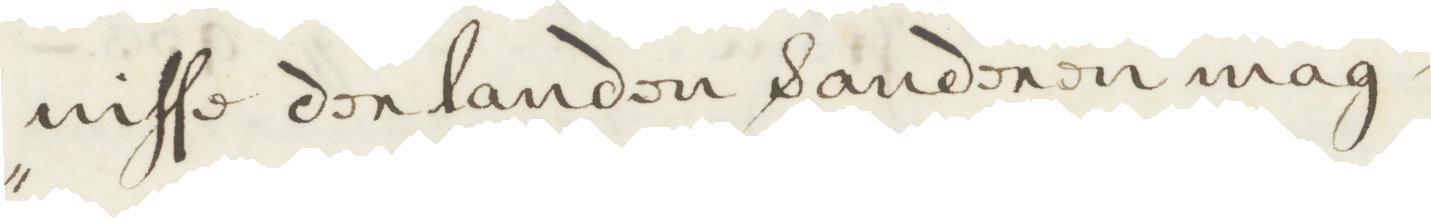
„nisse der landen veranderen mag
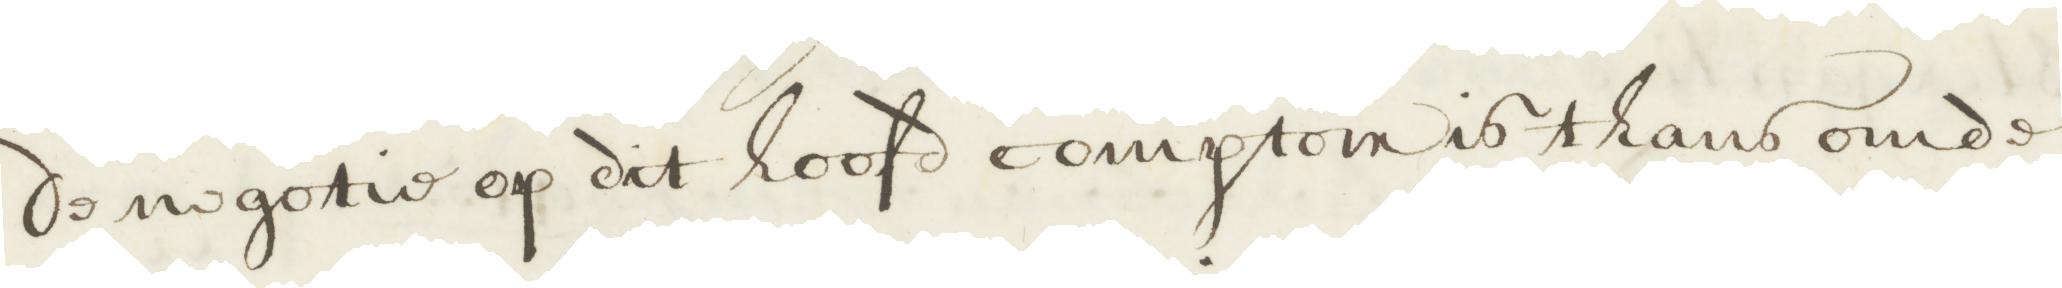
de negotie op dit hoofd comptoir is thans omde
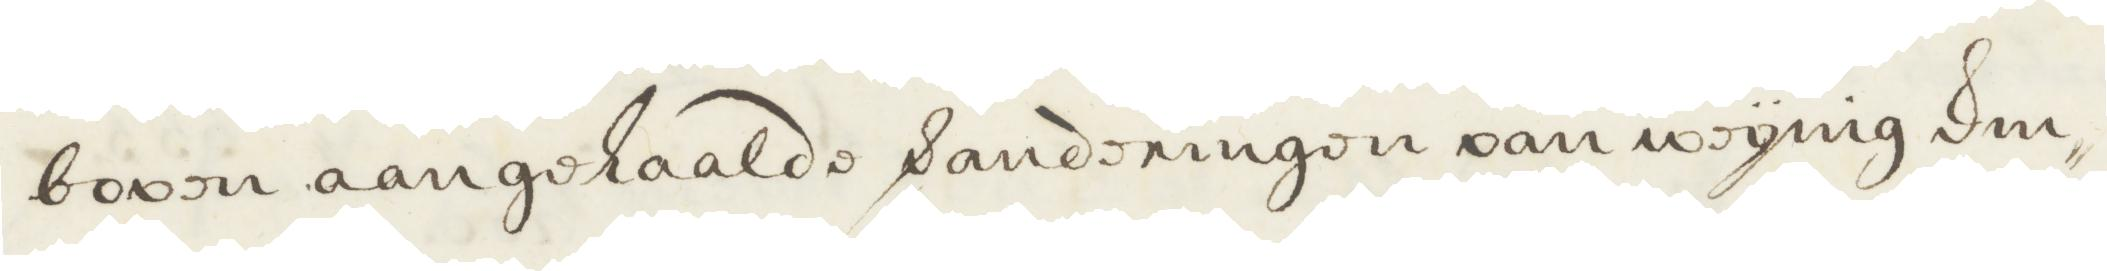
boven aangehaalde veranderingen van weijnig Im„
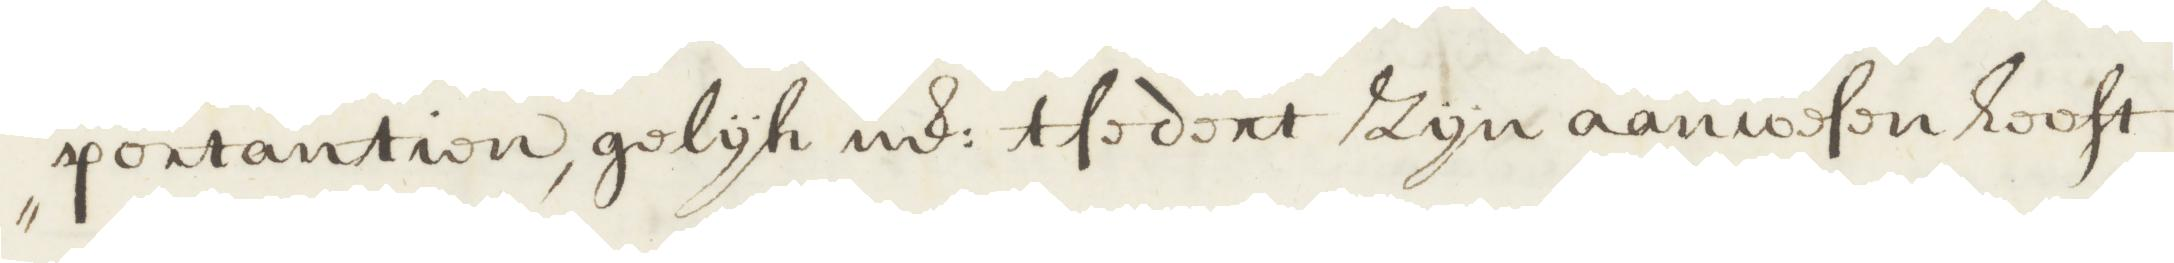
portantien, gelijk uE: t sedert zijn aanwesen heeft
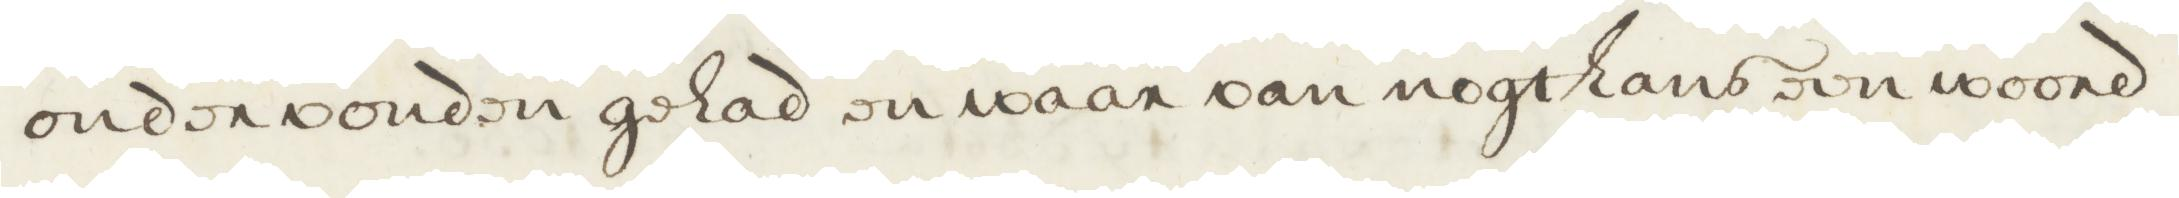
ondervonden gehad en waar van nogthans een woord
